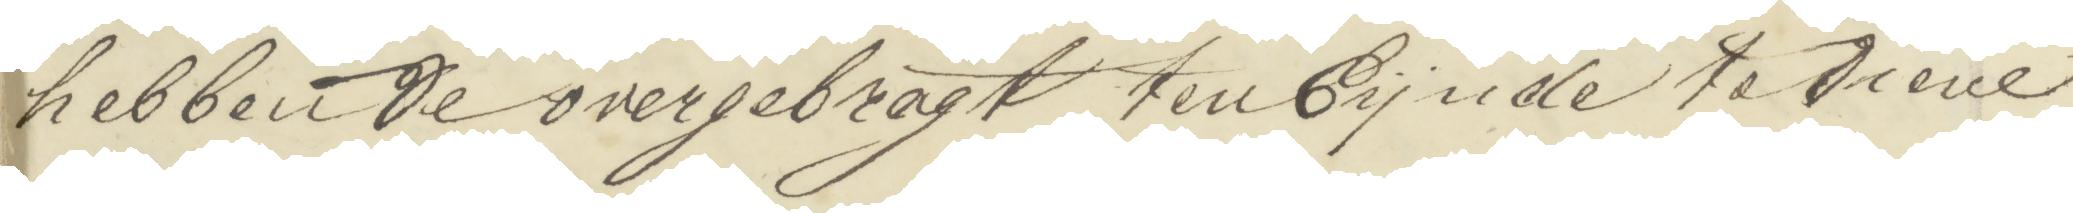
hebbende overgebragt ten Eijnde te diene
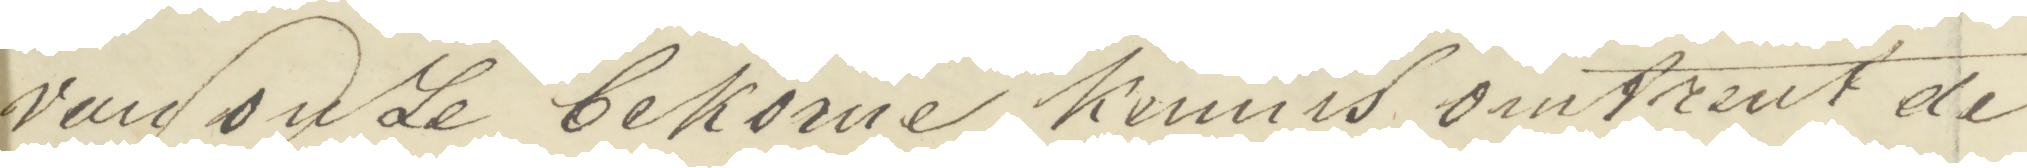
van onze bekome kennis omtrent de
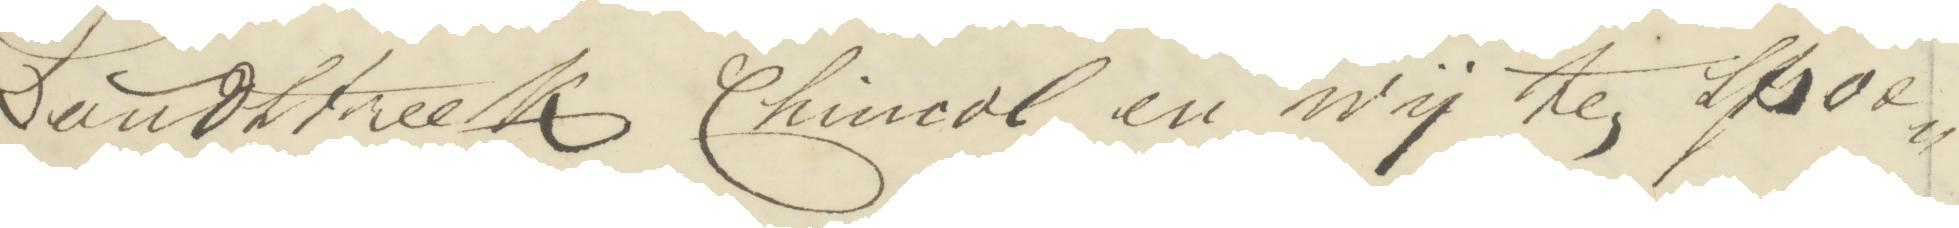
Landstreek Chincol en wij ten spoe„
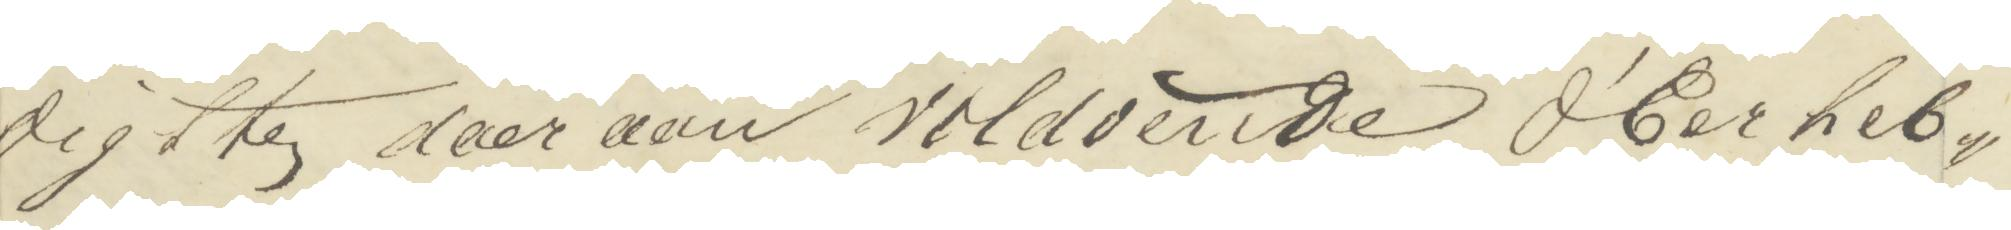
digsten daer aan voldoende d'Eer heb„
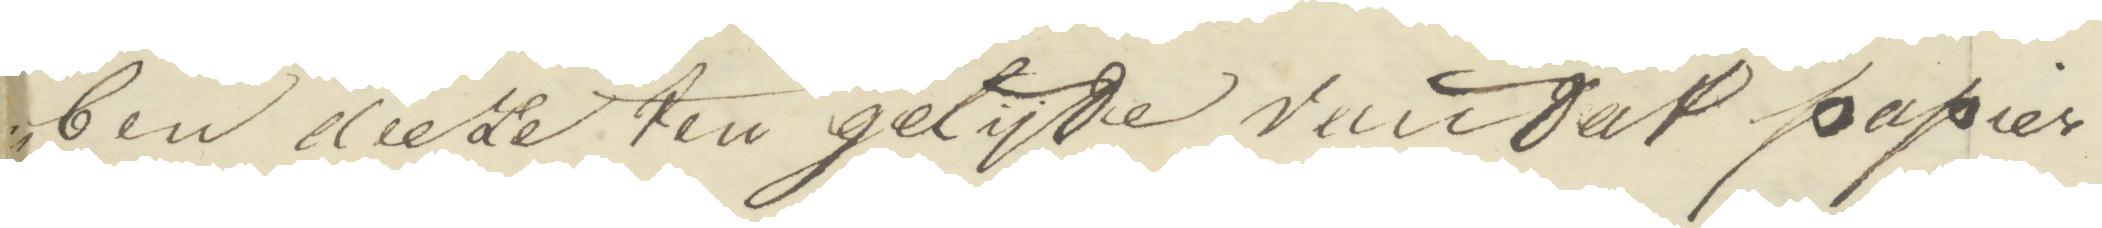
„ben deeze ten gelijde van dat papier
